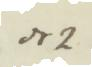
n 2
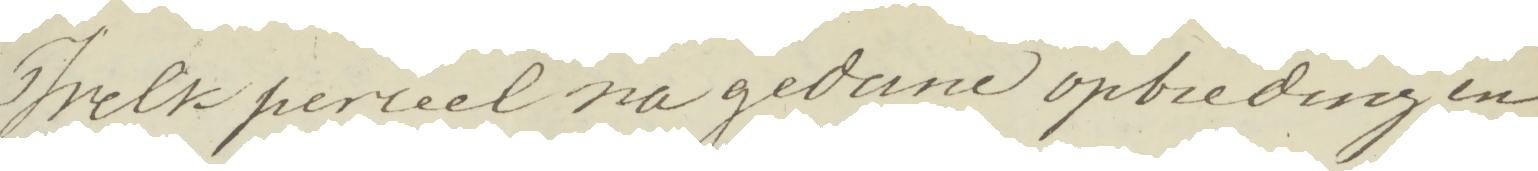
Welk perceel na gedane opbieding en
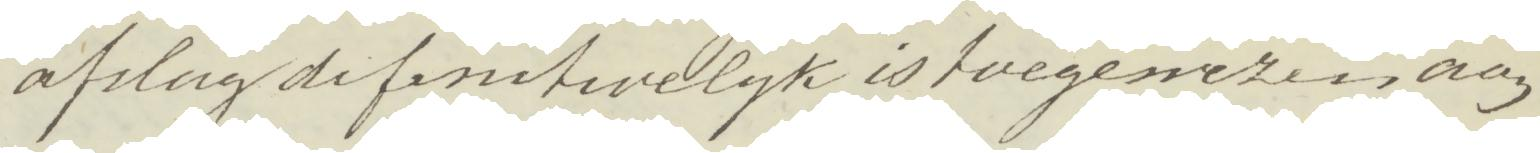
afslag definitievelyk is toegewezen aan
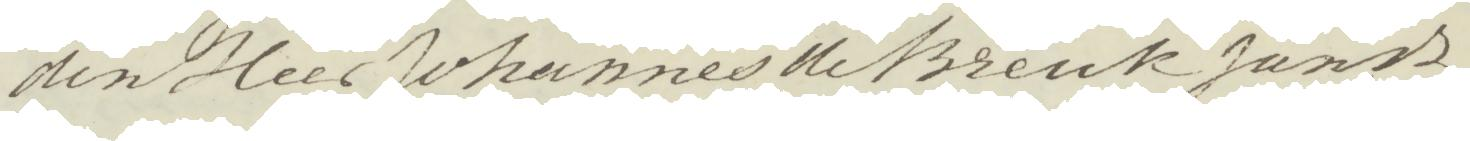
den Heer Johannes de Breuk Jansz
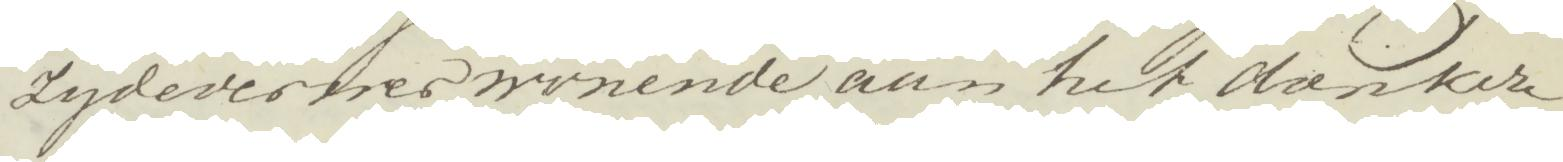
zydeverver, wonende aan het donkere
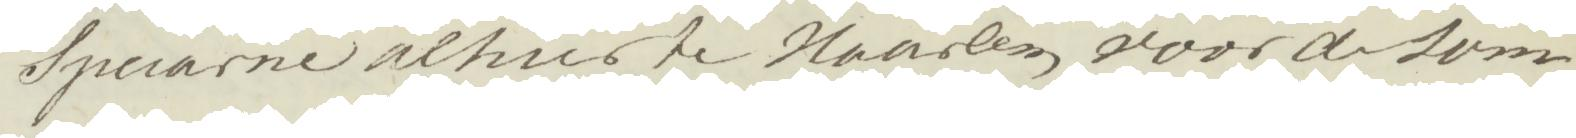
Spaarne alhier te Haarlem voor de som:
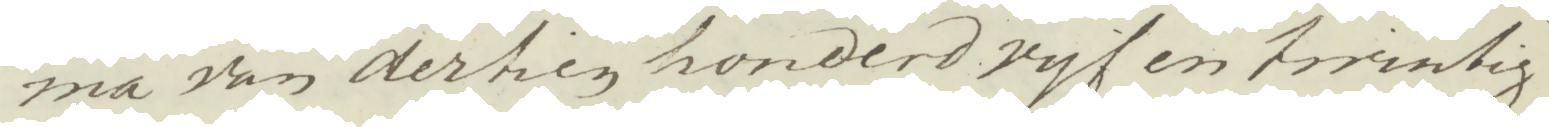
ma van dertien honderd vijf en twintig
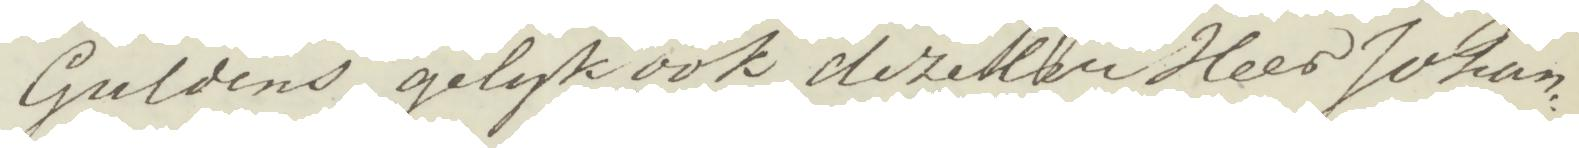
Guldens, gelyk ook dezelve Heer Johan:
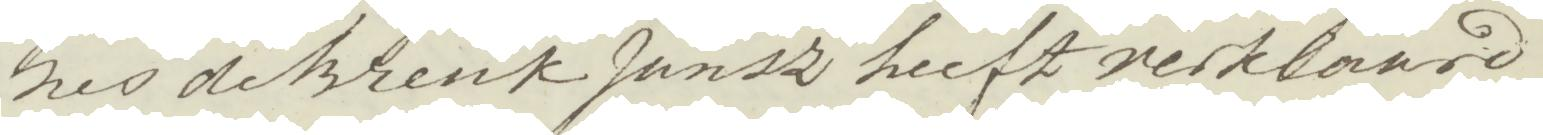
nes de Breuk Jansz heeft verklaard
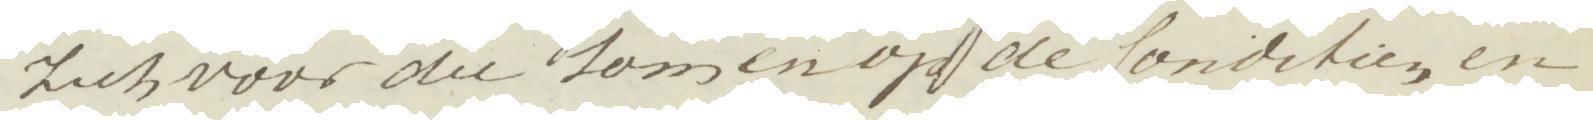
zich voor die som en op de conditien en
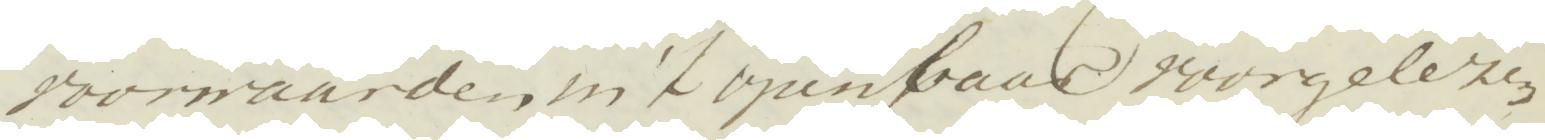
voorwaarden in ’t openbaar voorgelezen
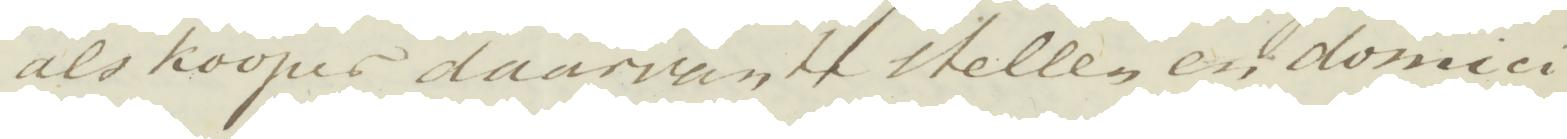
als kooper daarvan te stellen en domici
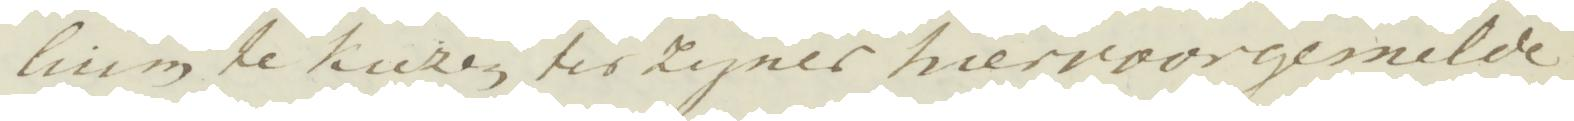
lium te kiezen ter zyner hiervoorgemelde
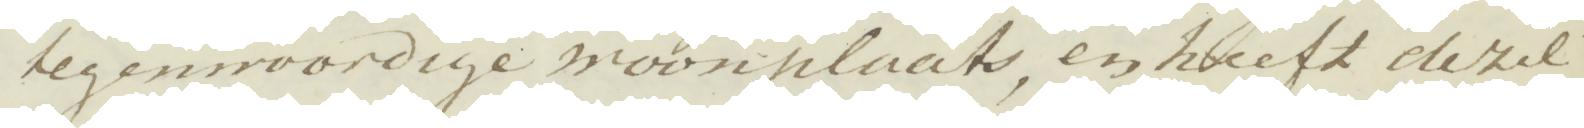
tegenwoordige woonplaats, en heeft dezel:
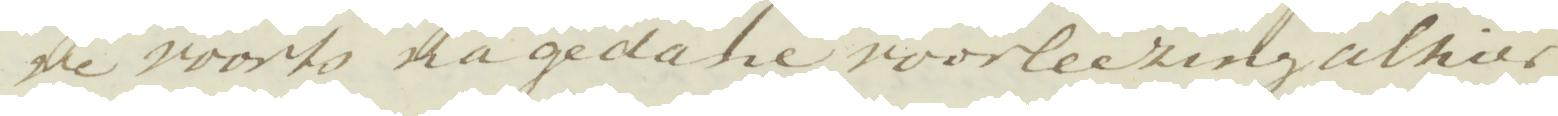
ve voorts na gedane voorleezing alhier
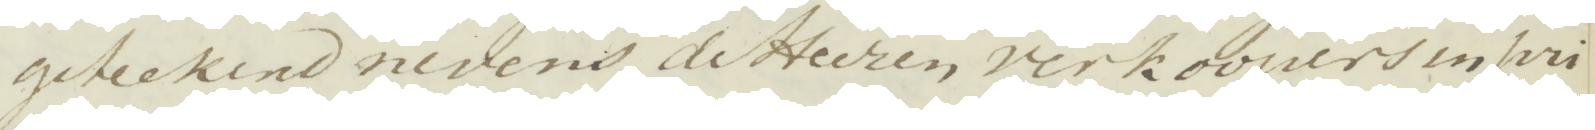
geteekend nevens de Heeren verkoopers in pri
